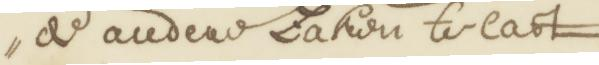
„de andere zaken te last
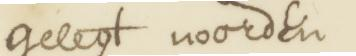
gelegt worden
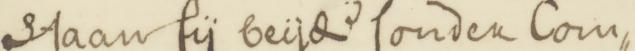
staan sij beijde sonder Com„
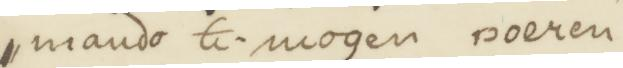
„mando te mogen voeren
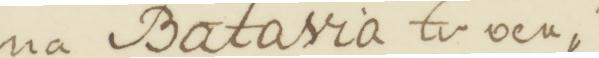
na Batavia te ver„
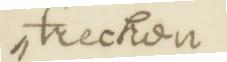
„trecken
